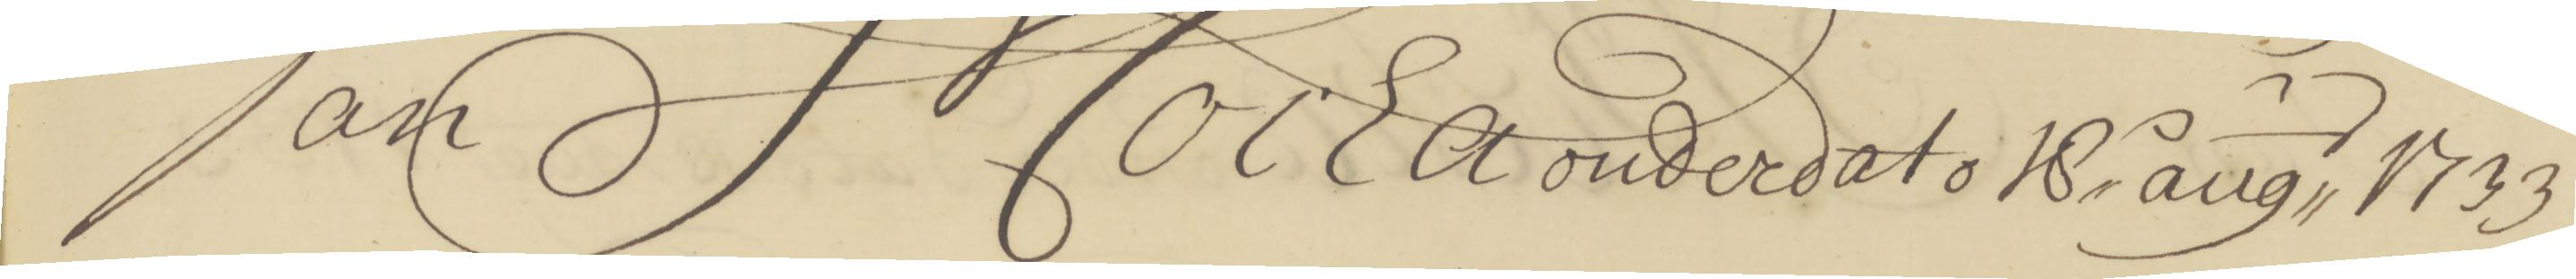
Van Mocha onderdato 18„' aug„s 1733
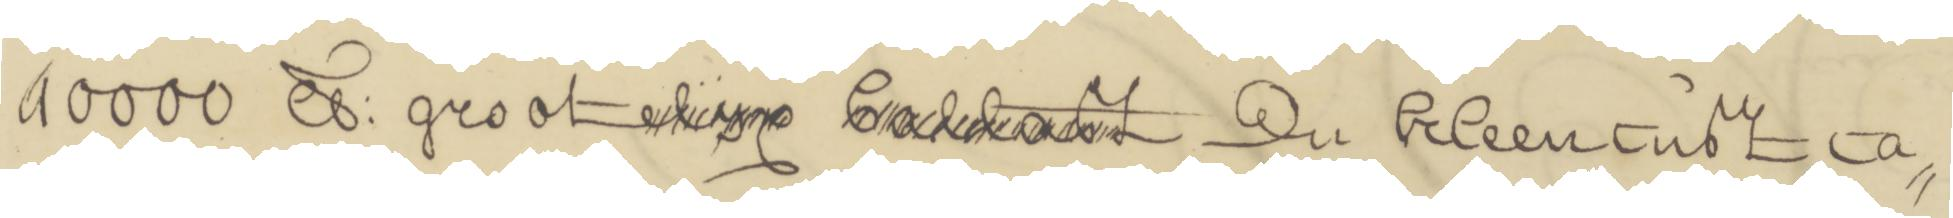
40000 lb: grootelijx ballast En kleen cust ca„
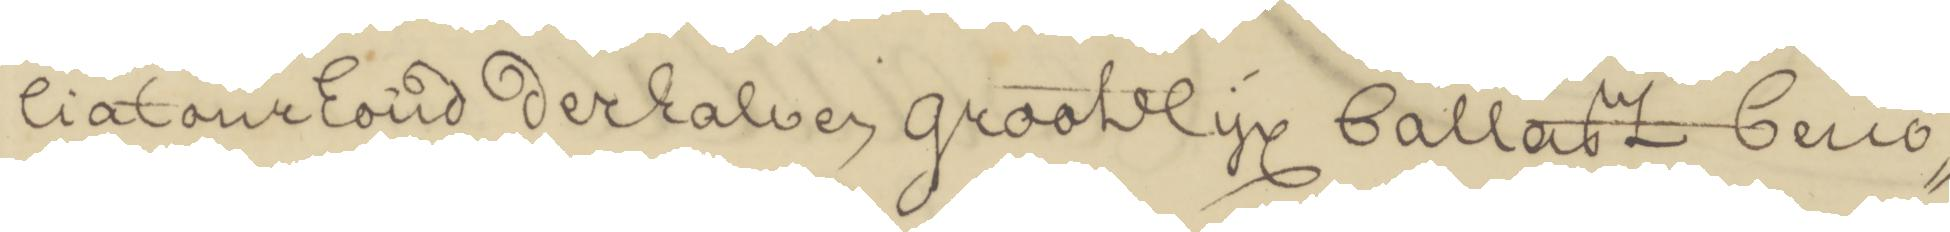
liatour houd derhalven grootelijx ballast beno„
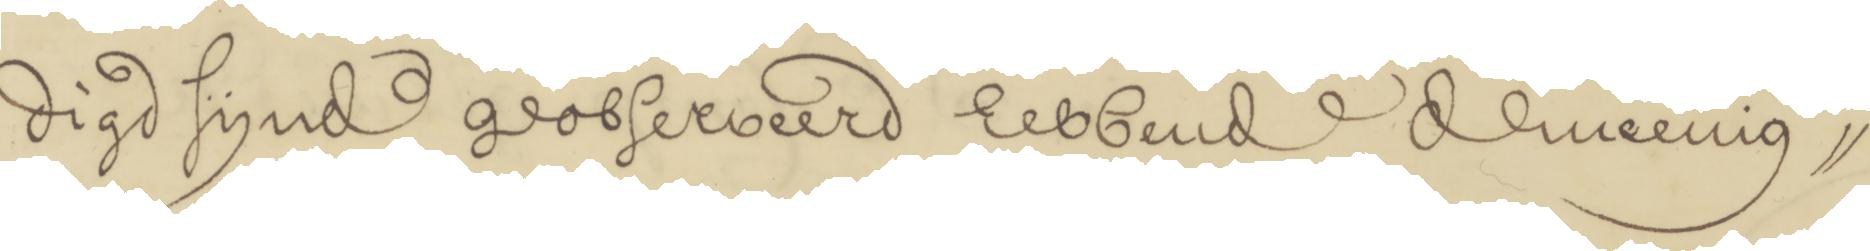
digd sijnde geobserveerd hebbende de meenig„
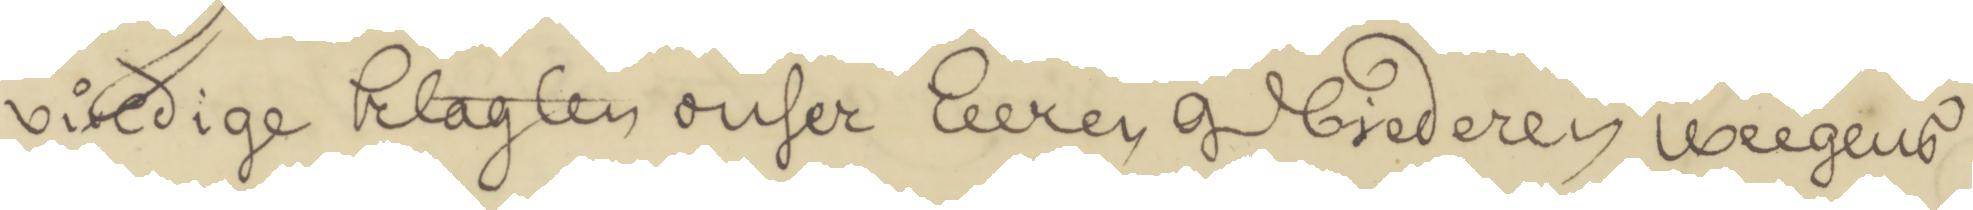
vuldige klagten onser heeren gebiederen weegens
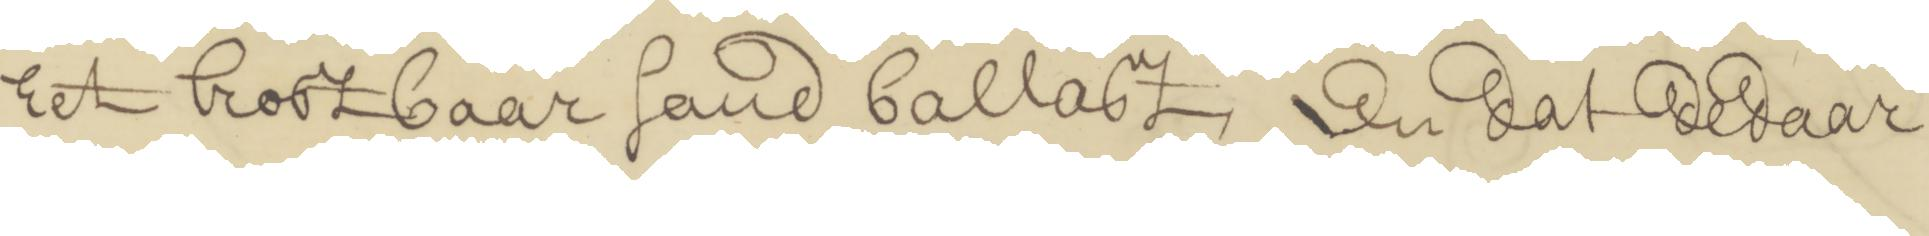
het kostbaar sand ballast, En dat de daar
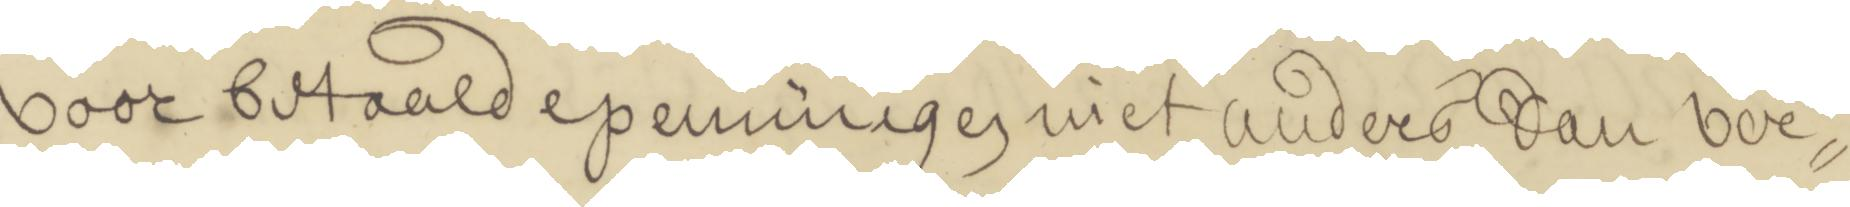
voor betaalde pennigen niet anders dan ver„
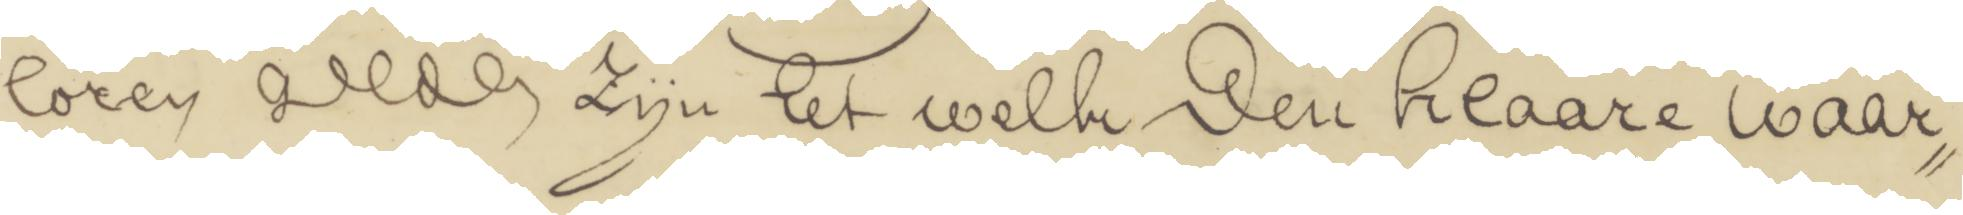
loren gelden zijn het welk Een klaare waar„
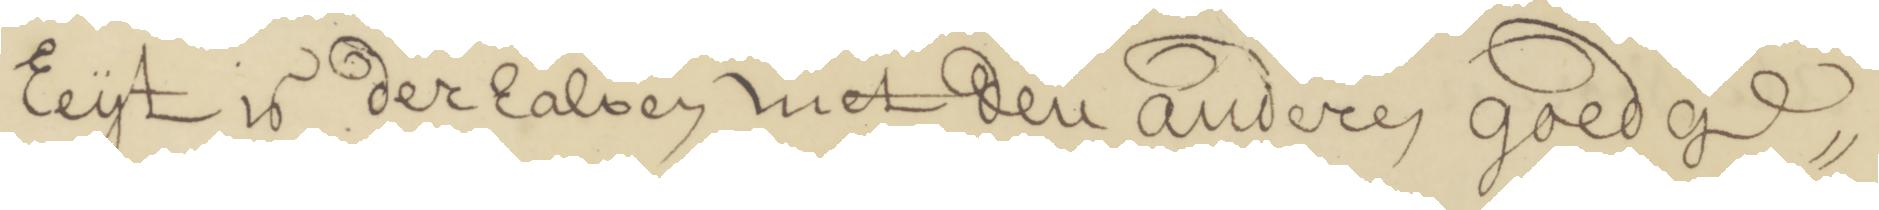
heijt is der halven met den anderen goed ge„
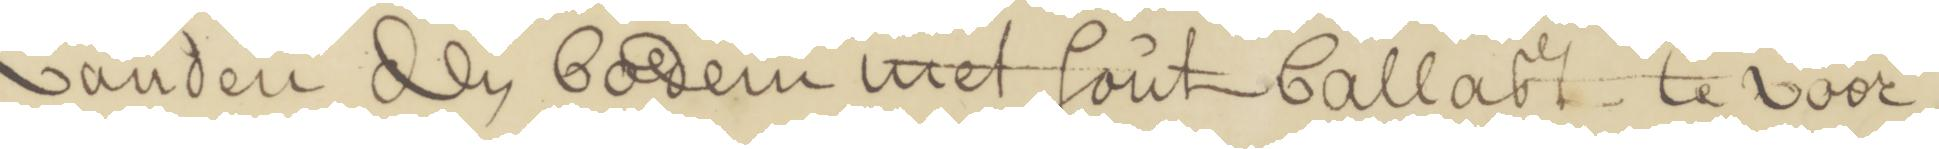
vonden den bodem met sout ballast te voor
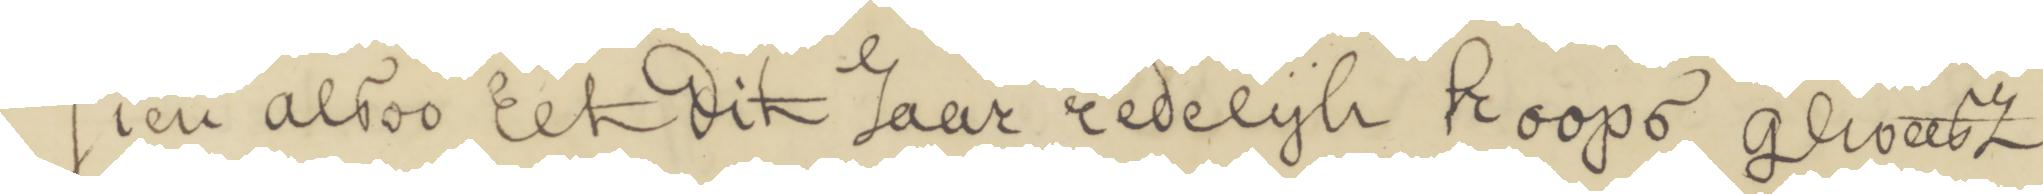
sien alsoo het dit Jaar redelijk koops geweest
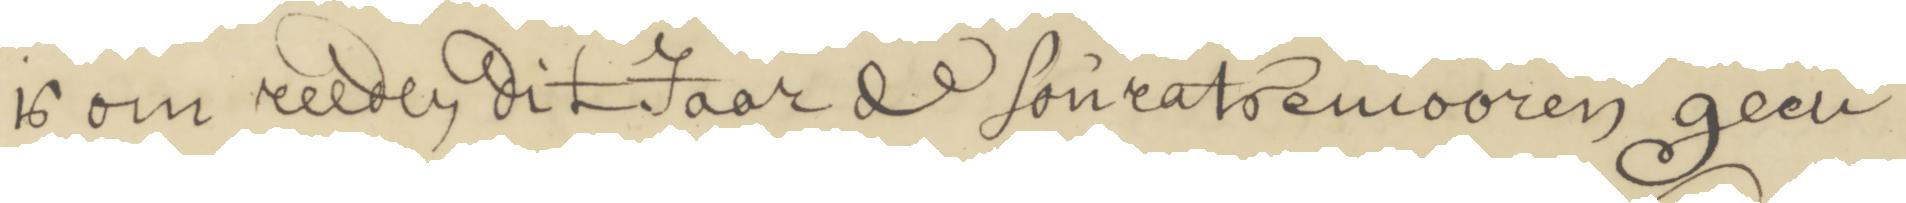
is om reeden dit Iaar de souratsemooren geen
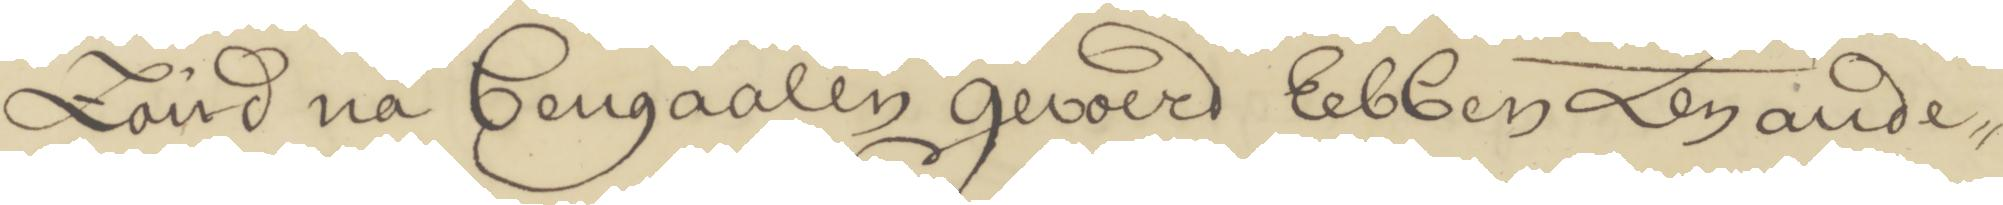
zoud na bengaalen gevoerd hebben ten ande„
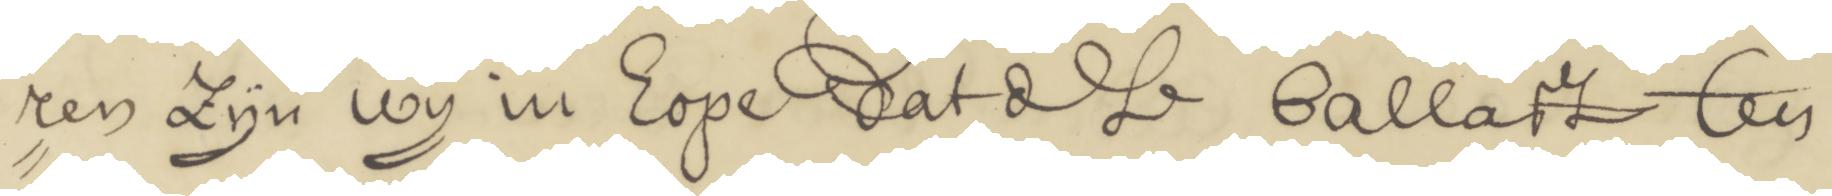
„ren zijn wij in hope dat dese ballast ten
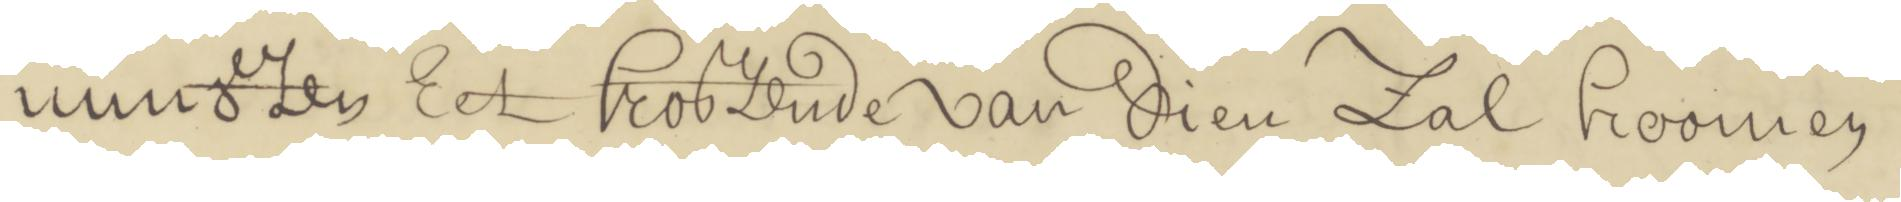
minsten het kostende van dien zal koomen
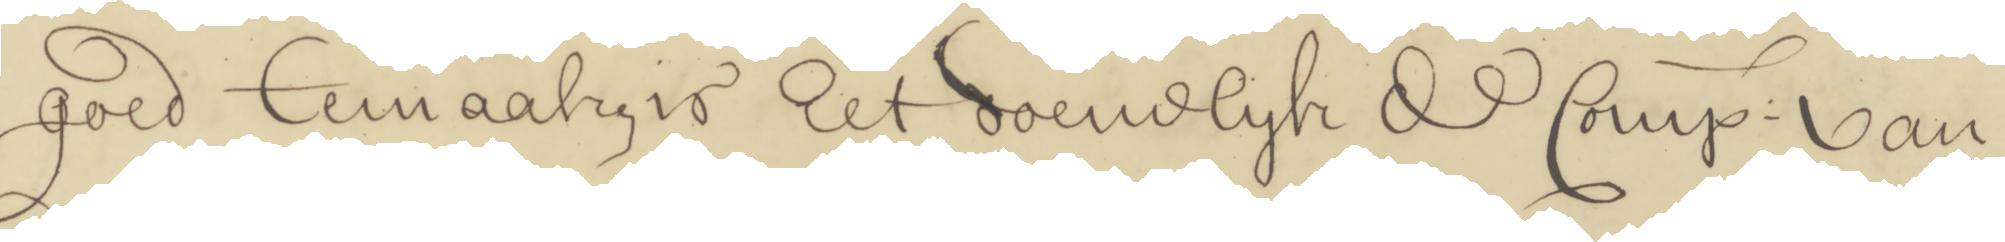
goed temaaken is het doenelijk de Comp: van
